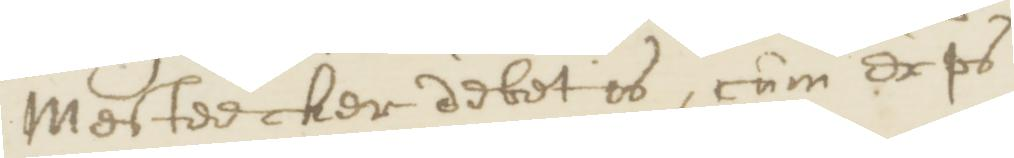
Mesteecker debet is, cum exps
